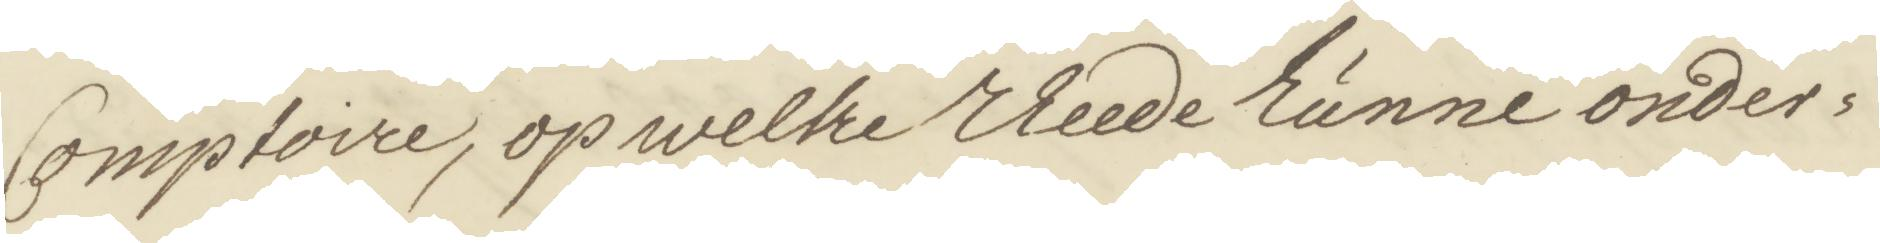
comptoire, op welke Rheede hunne onder„
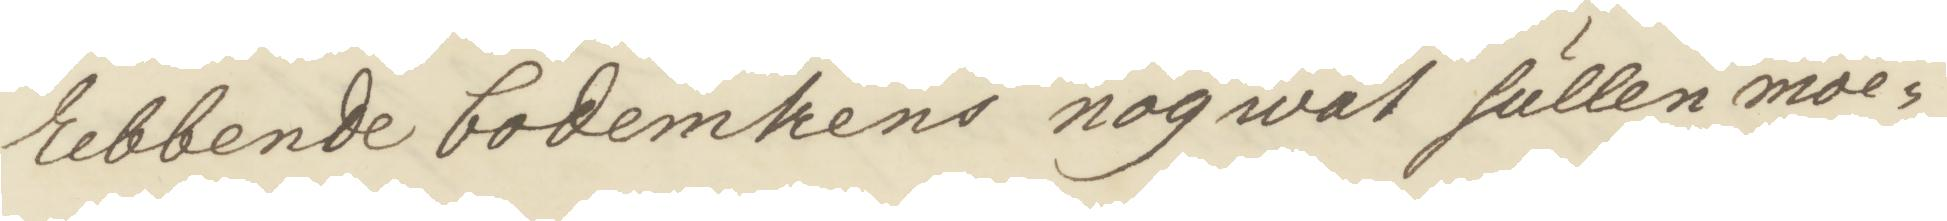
hebbende bodemkens nog wat sullen moe„
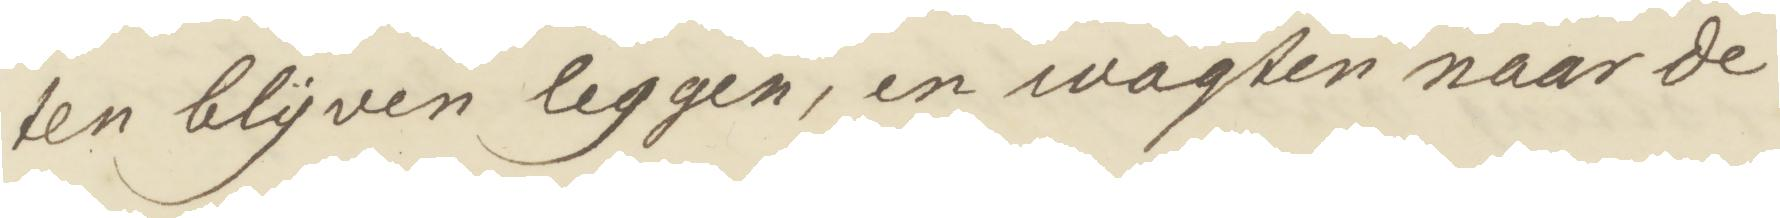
ten blijven leggen, en wagten naar de
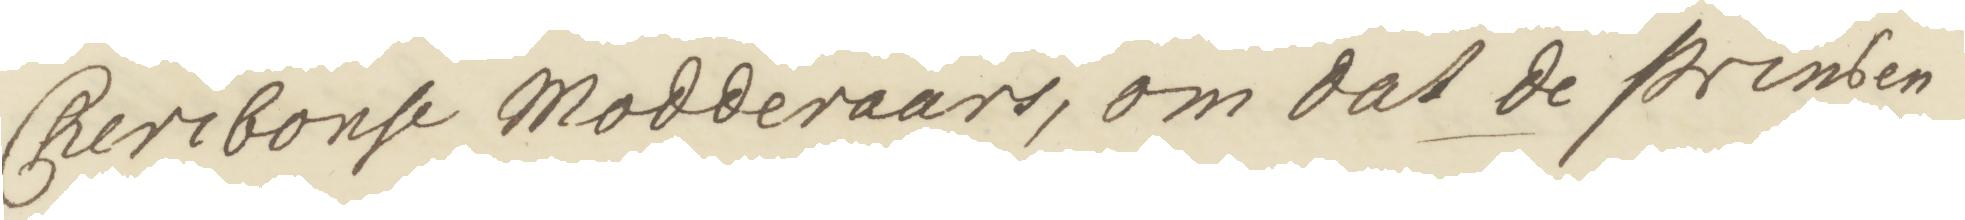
cheribonse Modderaars, om dat de prinsen
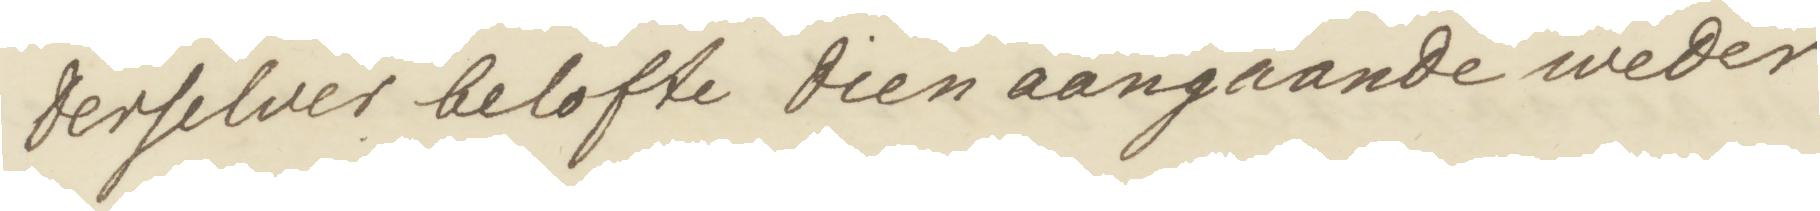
derselver belofte dien aangaande weder
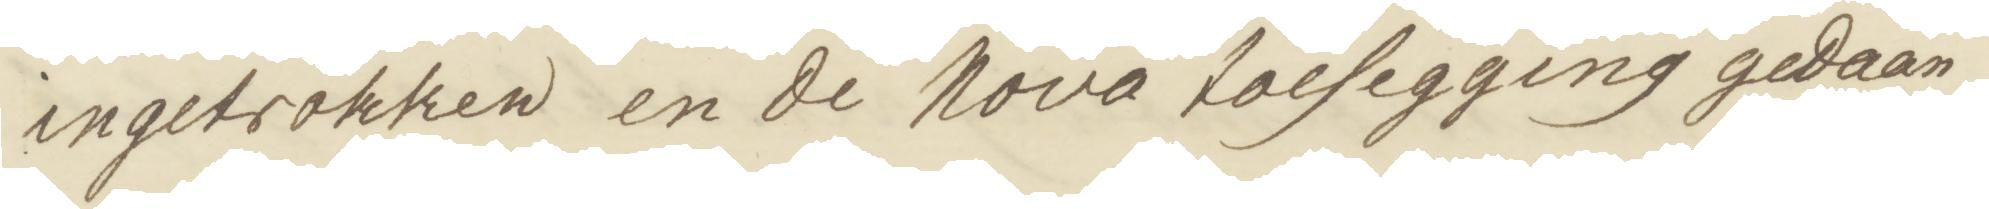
ingetrokken en de Nova toesegging gedaan
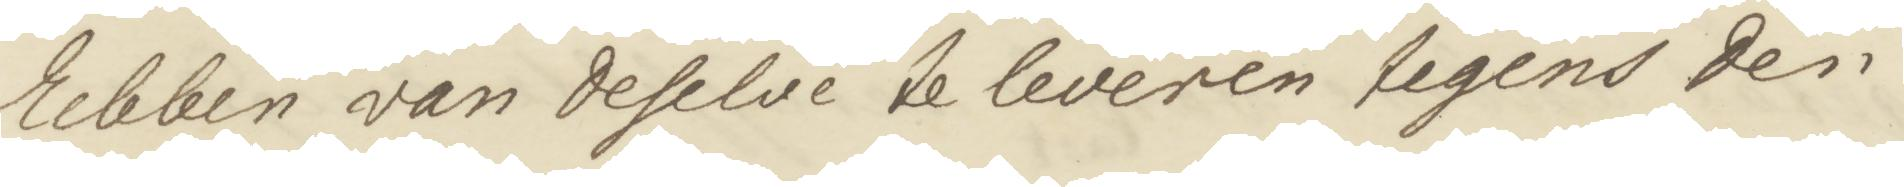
hebben van deselve te leveren tegens den
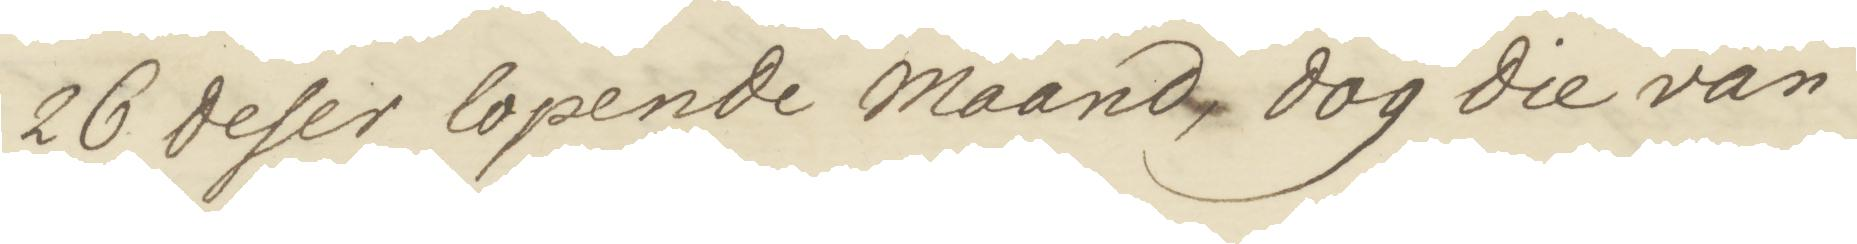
26 deser lopende maand, dog die van
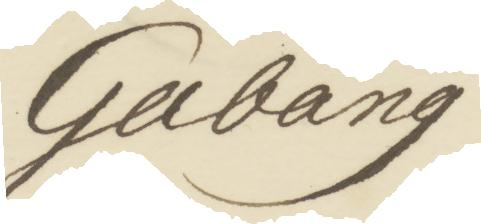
Gabang
